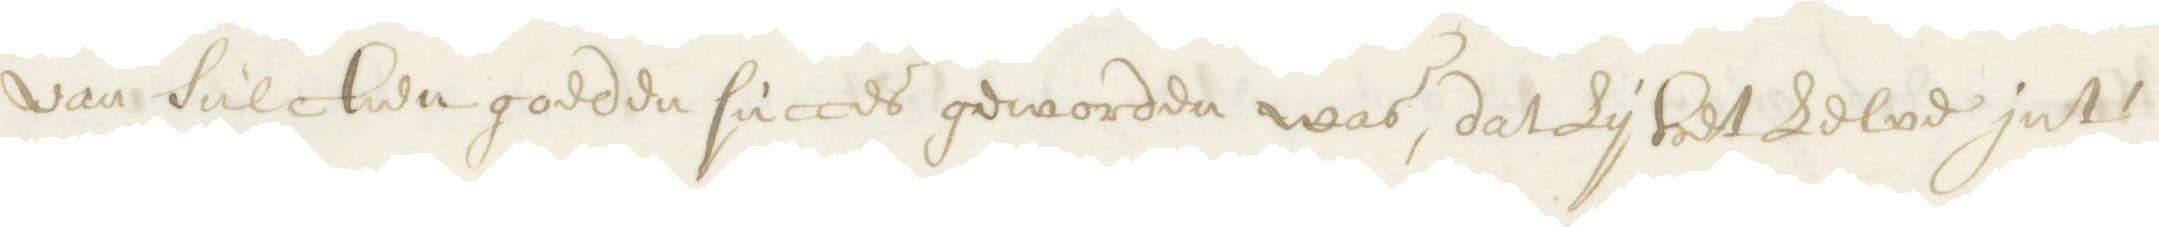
van sulcken goeden succes geworden was, dat zij het zelve int'
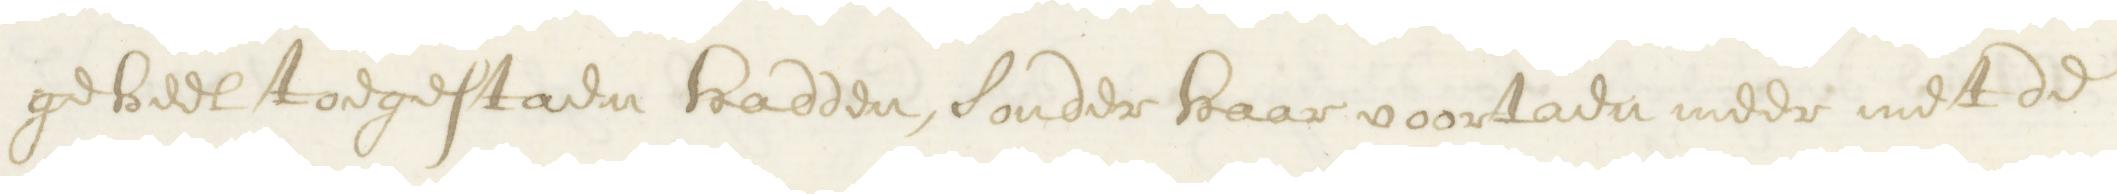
geheel toegestaen hadden, sonder haar voortaen meer met de
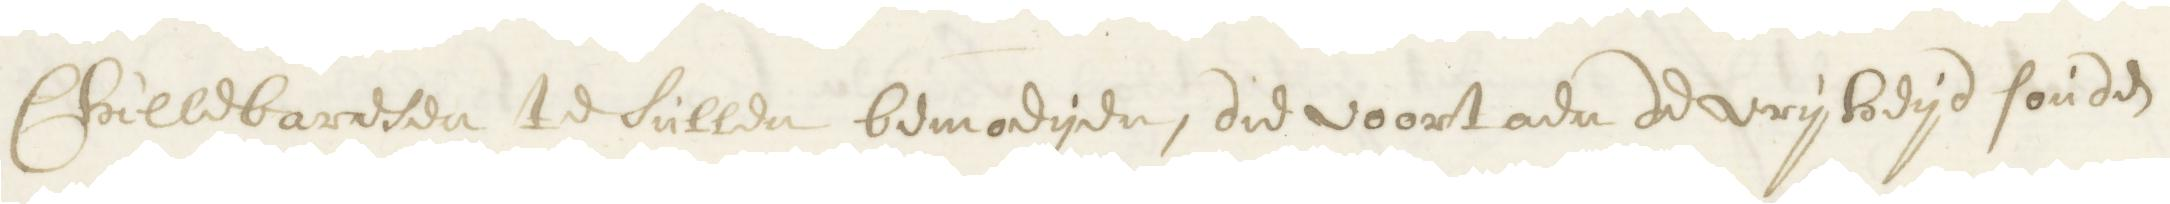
Chillebaresen te sullen bemoeijen, die voortaen de vrijheijd souden
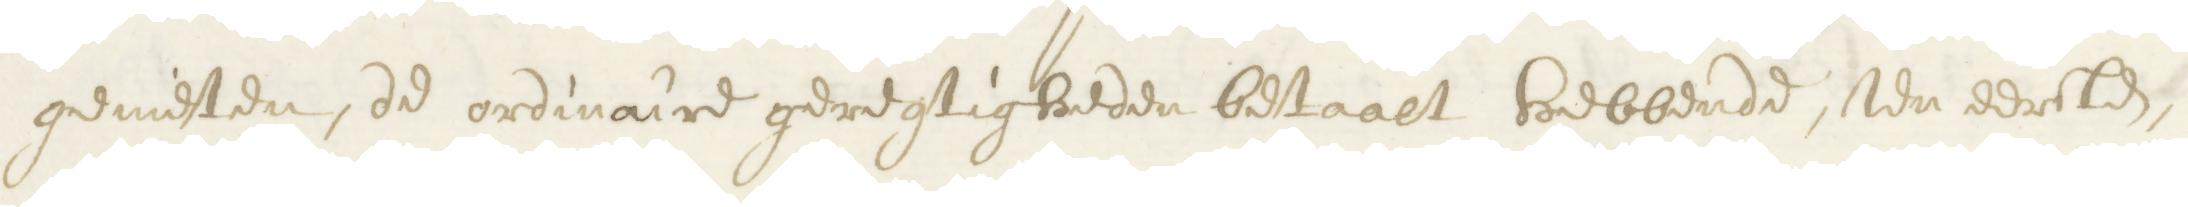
gemeten, de ordinaire geregtigheden betaalt hebbende; ten eersten,
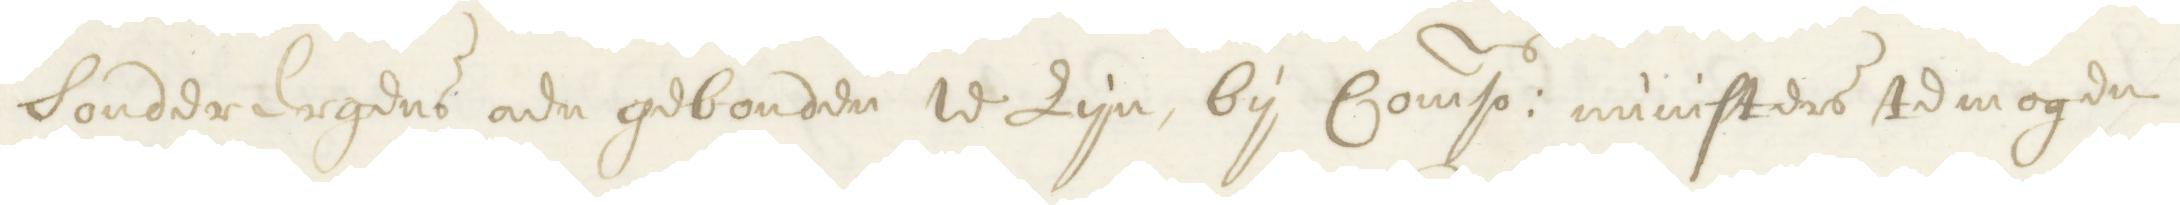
sonder Ergens aen gebonden te zijn, bij Comp:s ministers te mogen
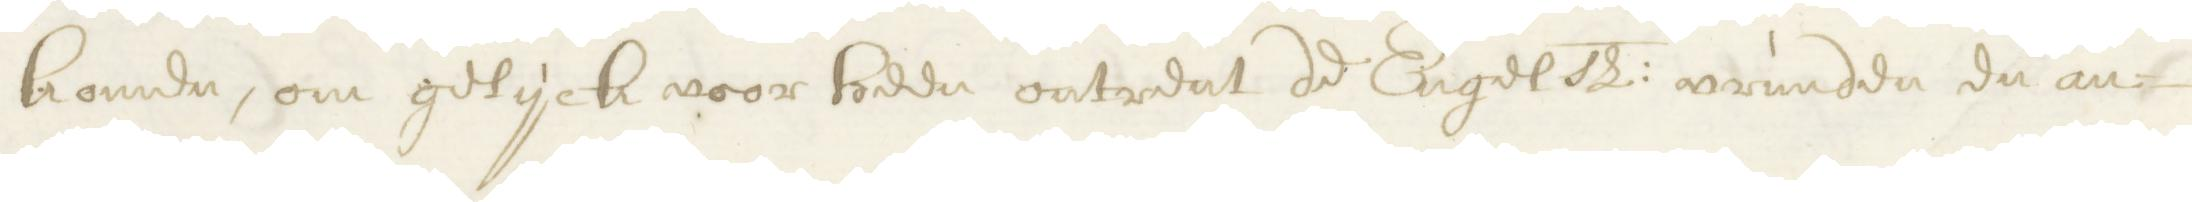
komen, om gelijck voor heen ontrent de Engelsz: vrunden en an=
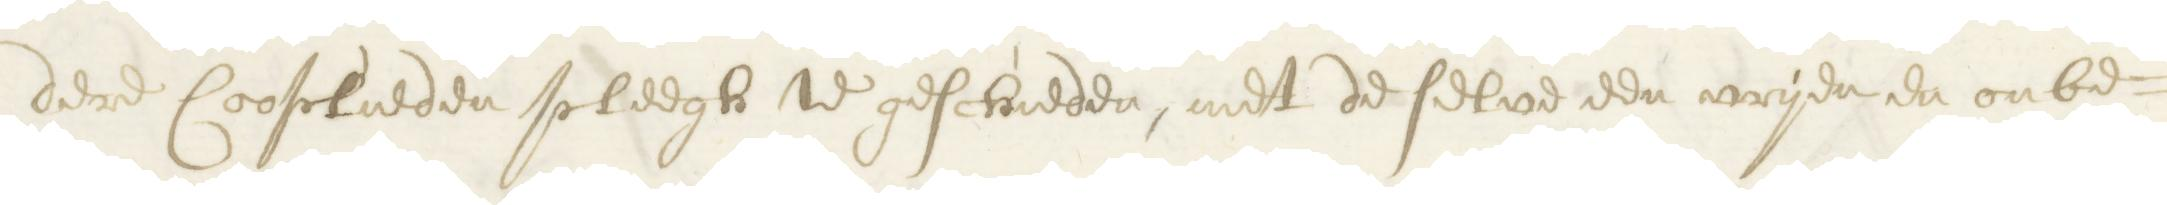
dere Cooplieden pleegh te geschieden, met deselve een vrijen en onbe=
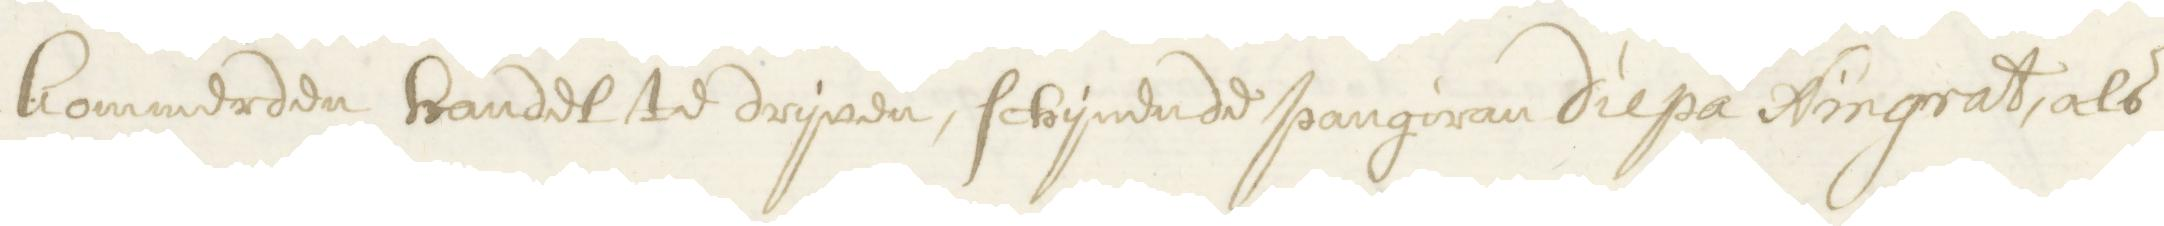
kommerden handel te drijven, schijnende pangiran diepa Ningrat, als
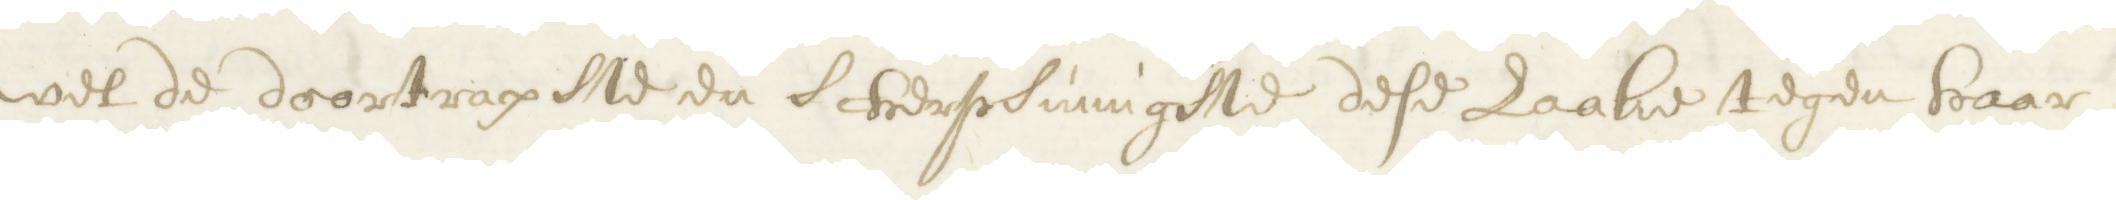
wel de doortrapste en scherpsinnigste dese zaake tegen haar
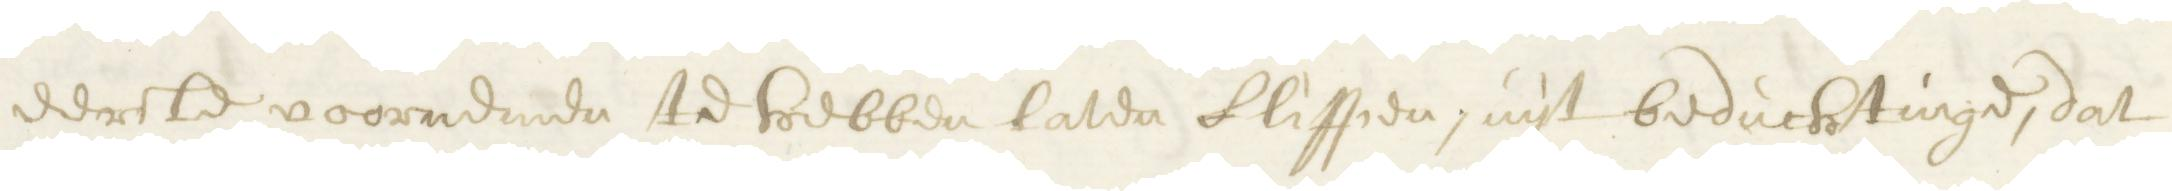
eerste voornemen te hebben laten slippen, uijt beduchtinge, dat
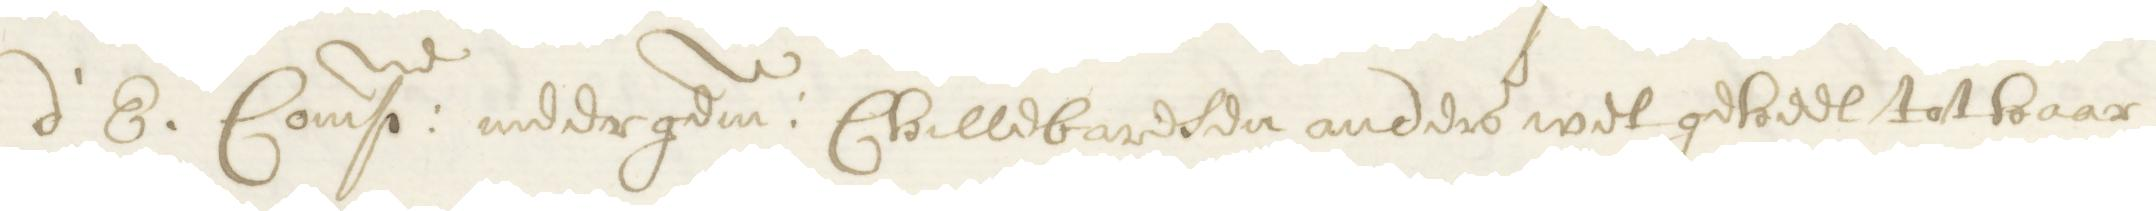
d’E. Comp:e meer gem: Chillebaresen anders wel geheel tot haar
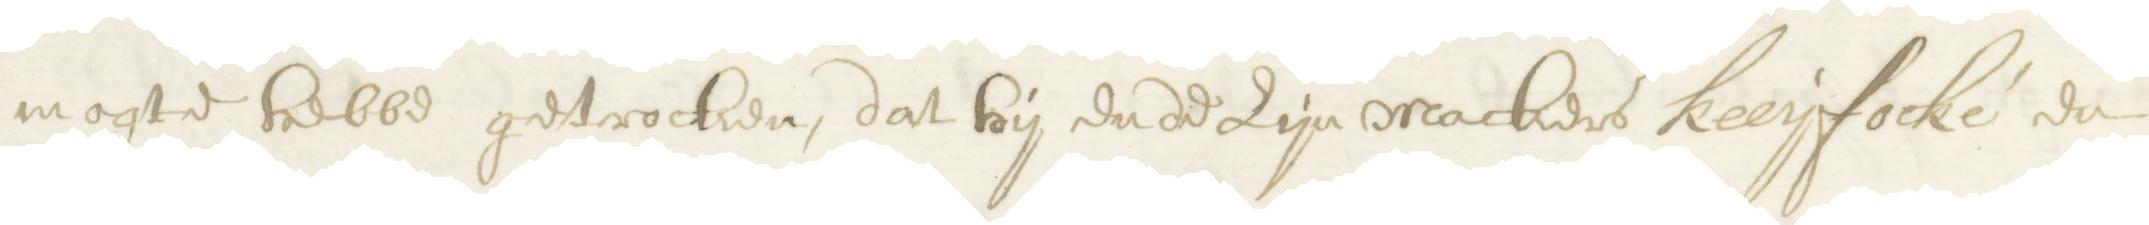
mogte hebbe getrocken, dat hij ende zijn Mackers keeijfocke en
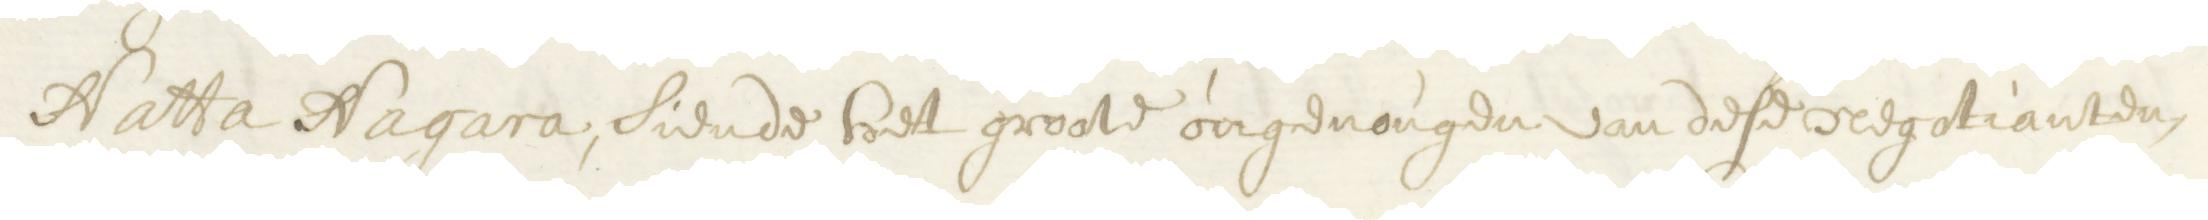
Natta Nagara, siende het groote ongenougen van dese Negotianten,
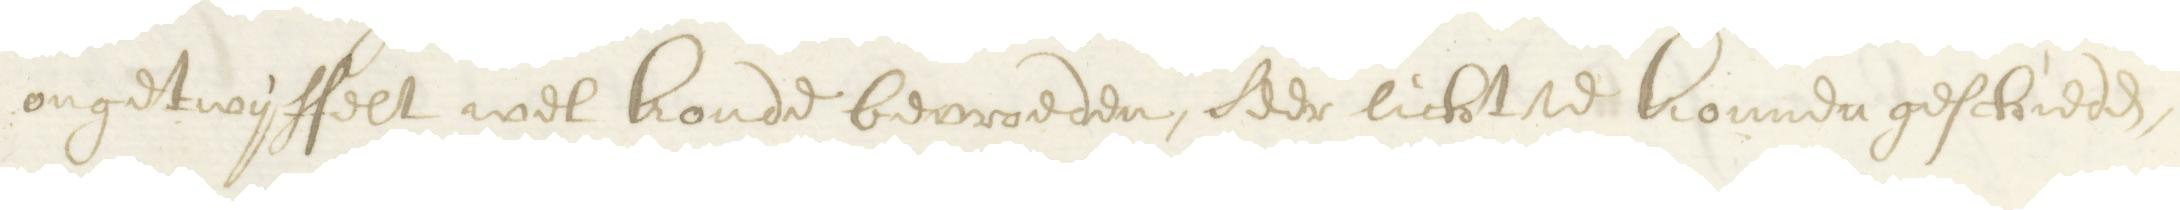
ongetwijffelt wel konde bevroeden, seer licht te konnen geschieden,
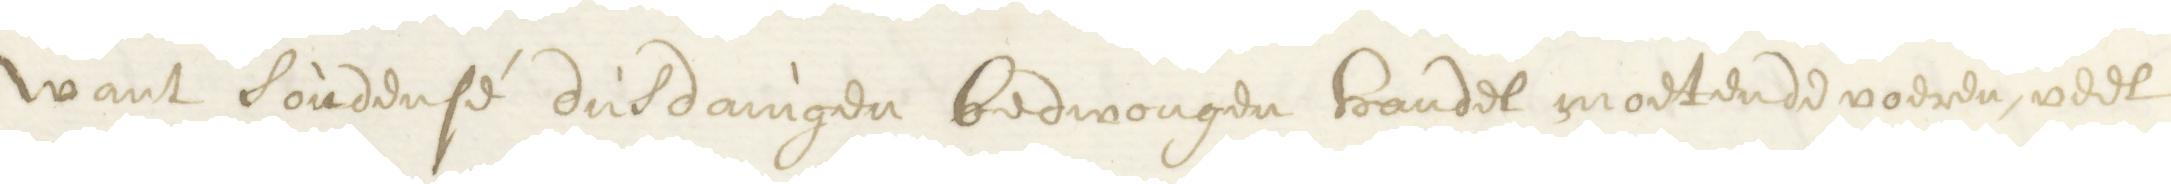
want soudense dusdanigen bedwongen handel moetende voeren, veel
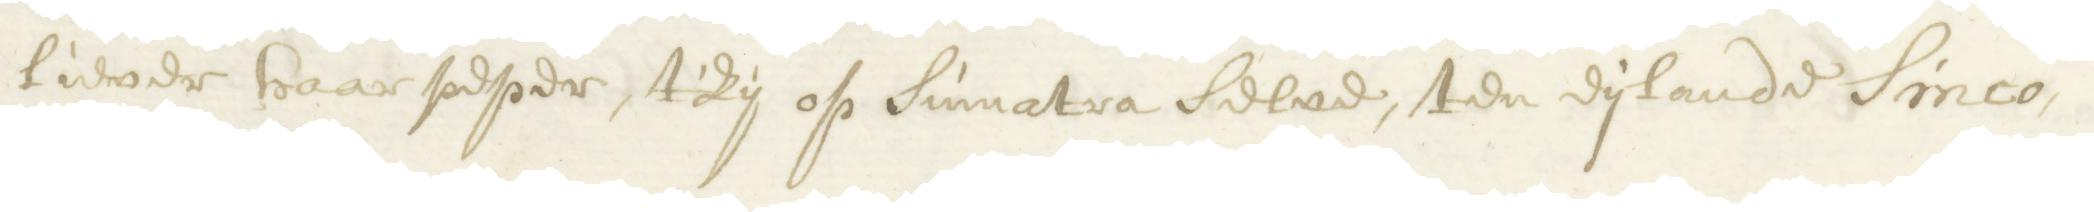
liever haar peper, t'zij op Sumatra selve, ten eijlande Sinco,
